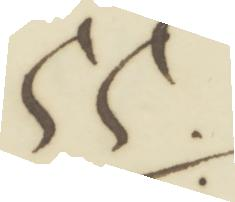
55 ./.
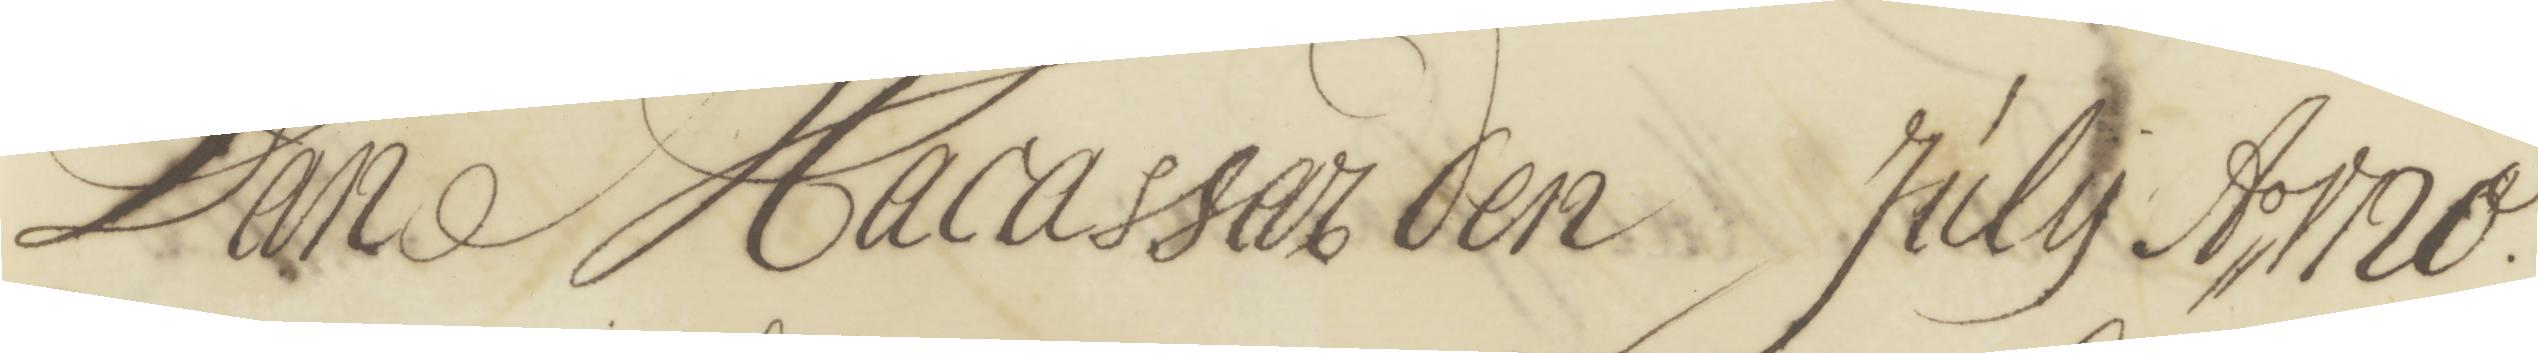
Van Macassar den Julij A„o 1720.
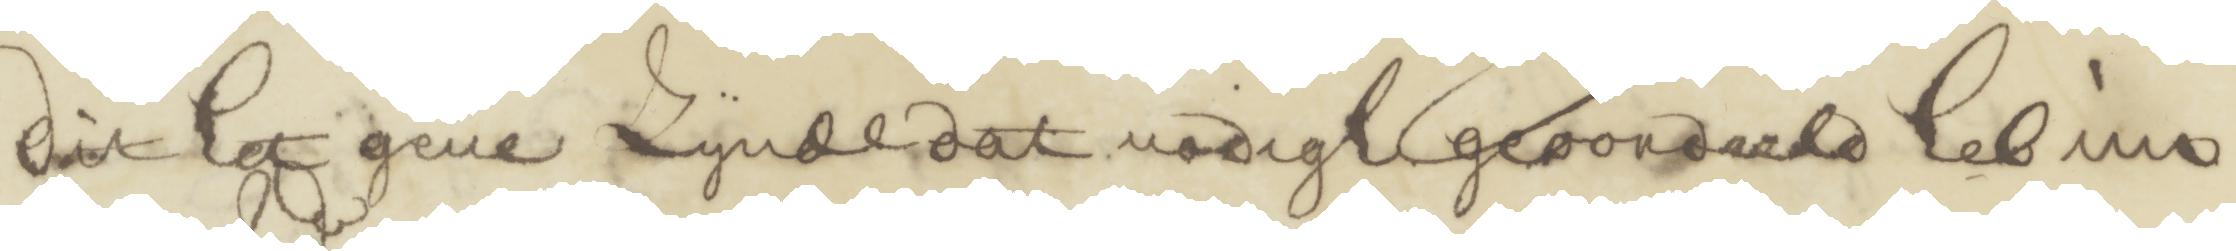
dat het gene zijnde dat nodigh geoordeeld heb uw
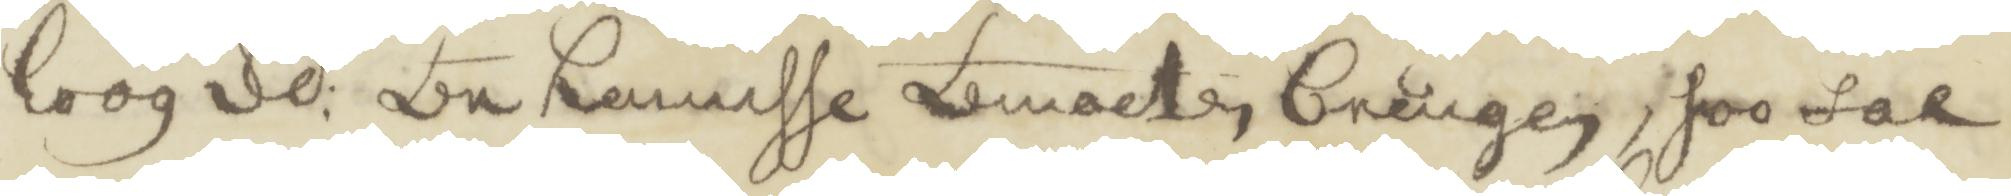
hoog Ed: ter kennisse temoeten brengen, soo sal
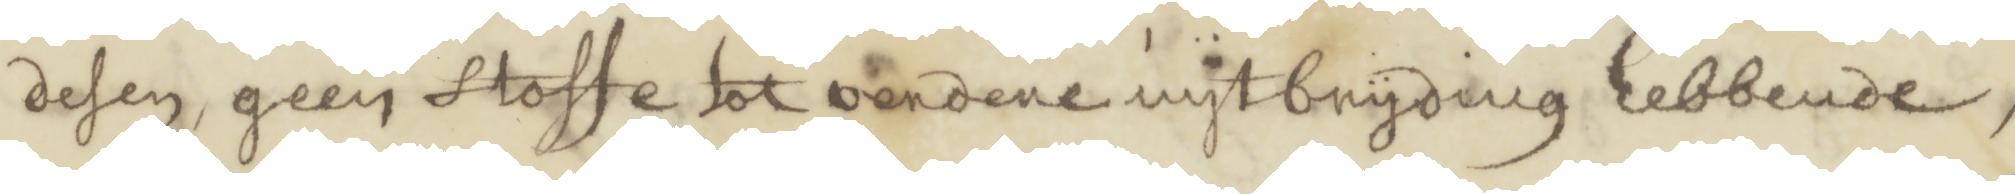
desen, geen stoffe tot verdere uijtbrijding hebbende,
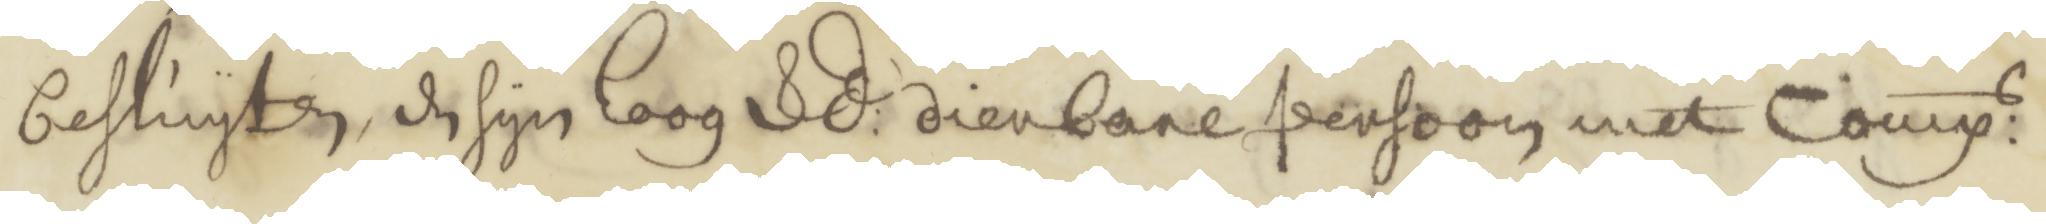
besluijten, en sijn hoog Ed: dierbare persoon met Comp:s
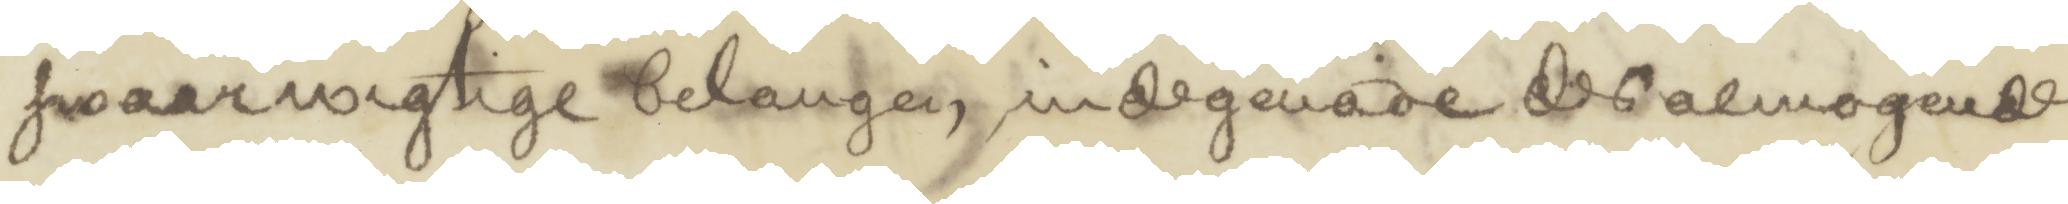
swaarwigtige belangen, in de genade des almogende
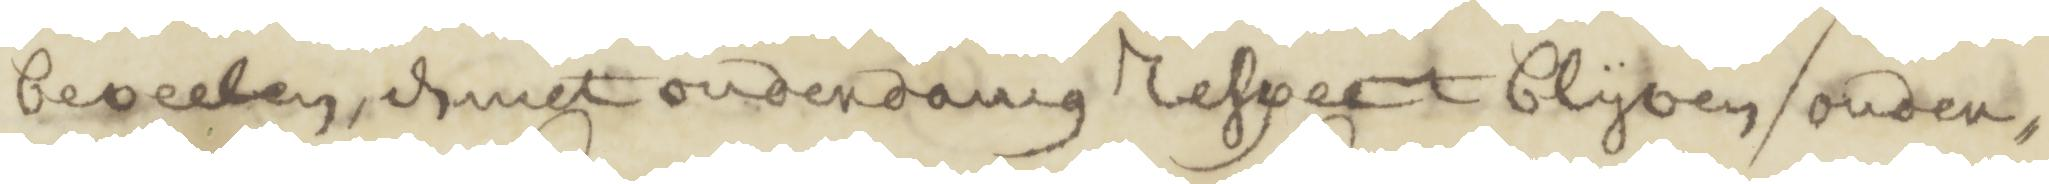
beveelen, en met onderdanig respect blijven / onder„
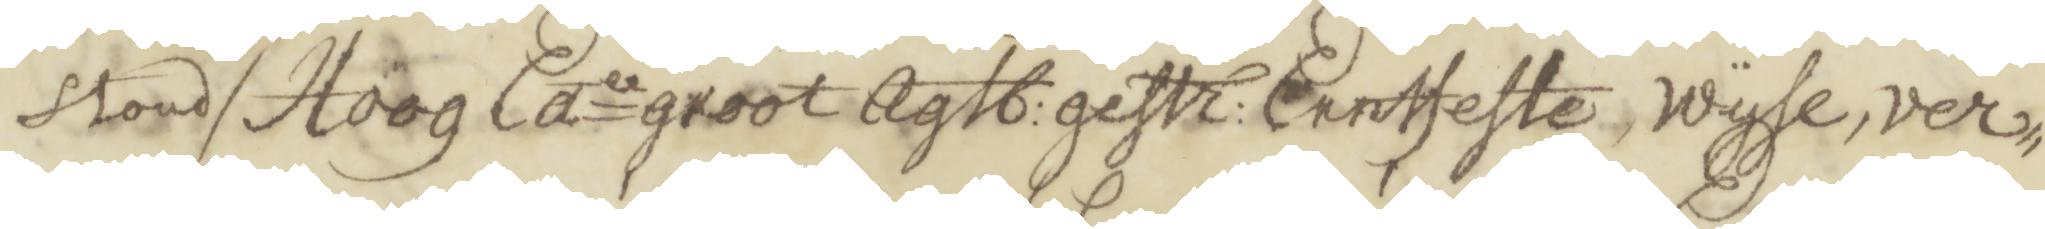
stond/ Hoog Ed=le groot Agtb: gestr: Erntfeste, wijse, ver„
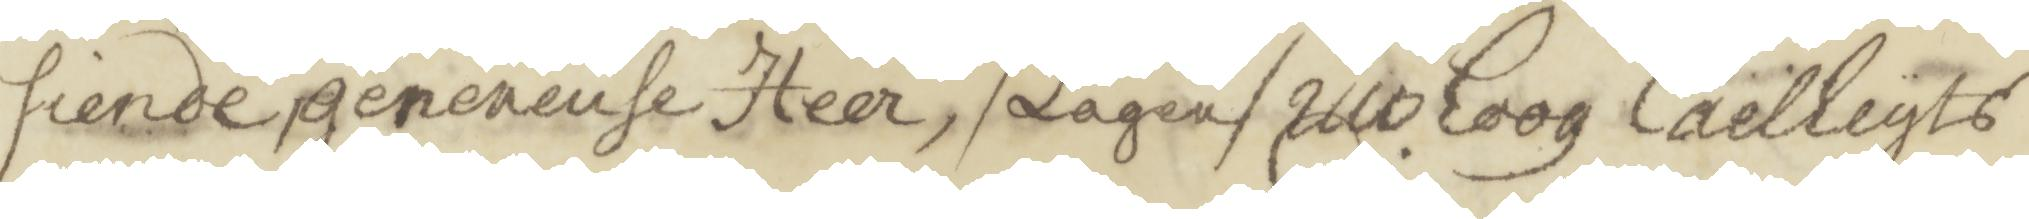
siende, genereuse Heer, /lager/ uw hoog Edelheijts
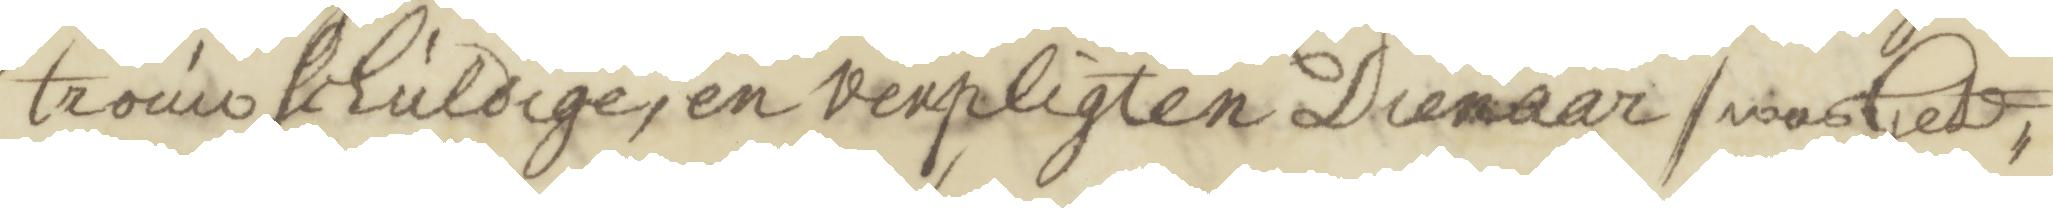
trouw schuldige, en verpligten Dienaar /was Gete„
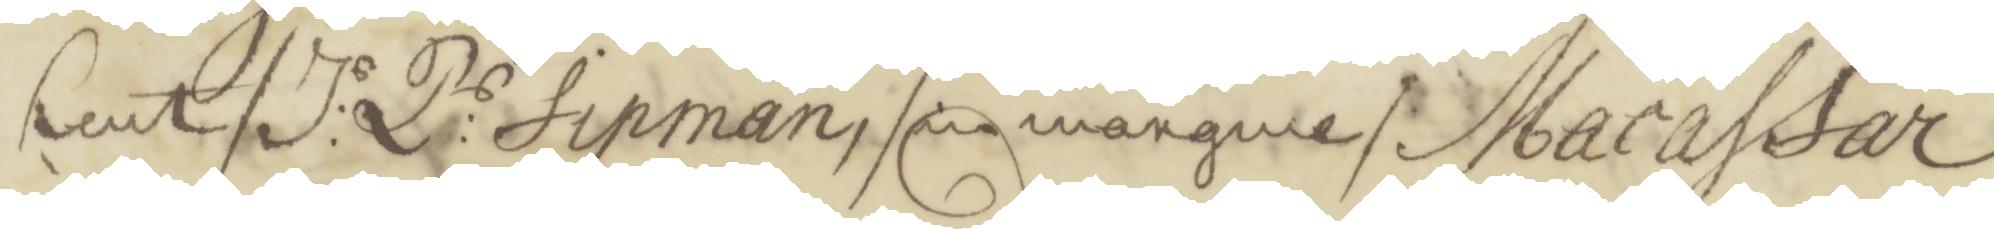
kent/ I:s P:s Sipman, /in margine / Macassar
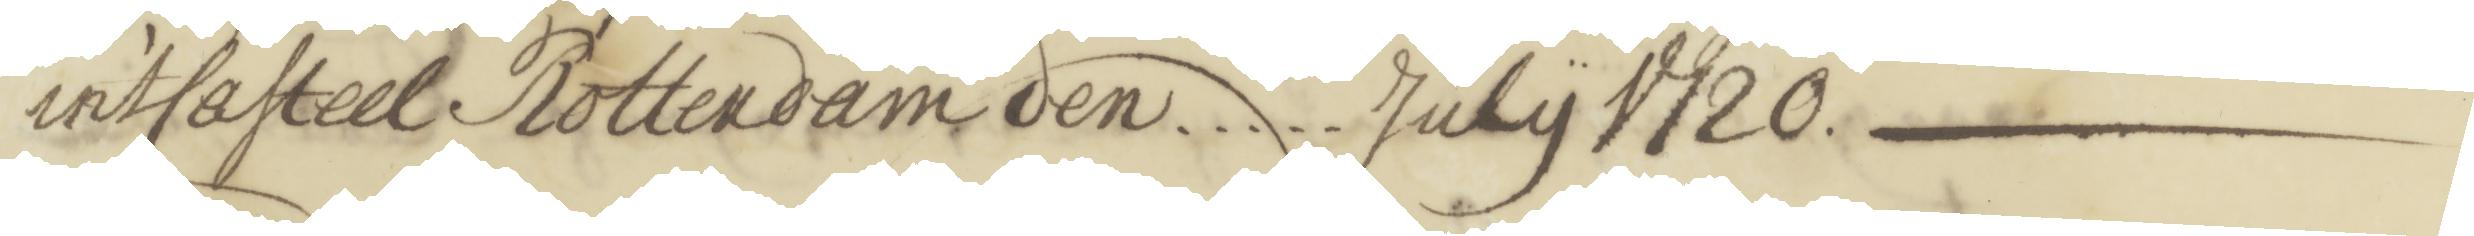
in't Casteel Rotterdam den . . . . . Julij 1720. —
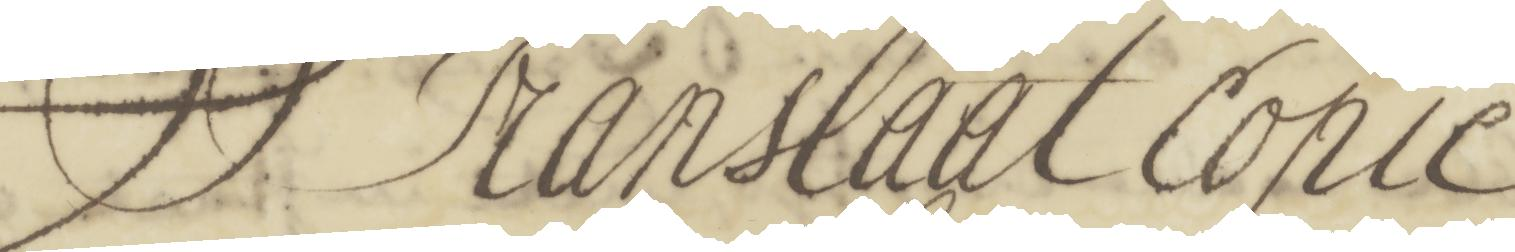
Translaat Copie
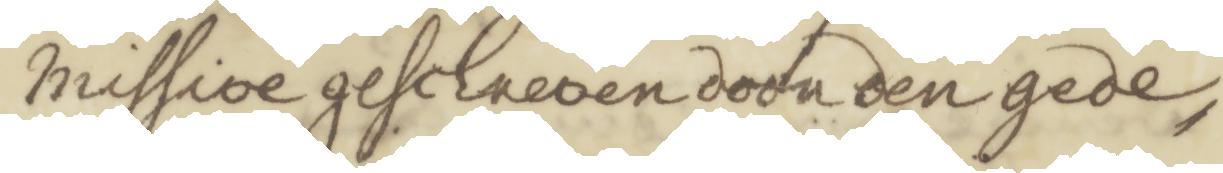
missive geschreven door den gede„
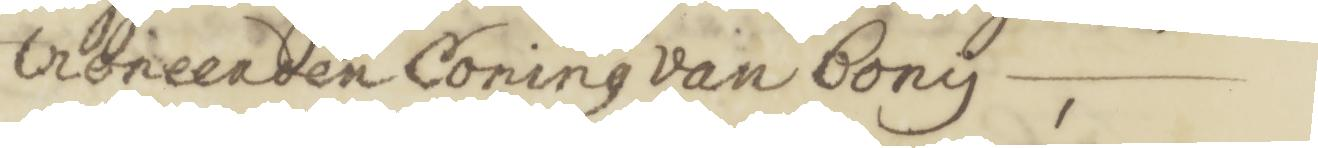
troneerden Coning van bonij —
